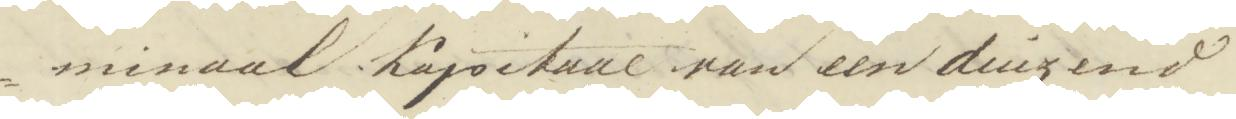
„minaal kapitaal van een duizend
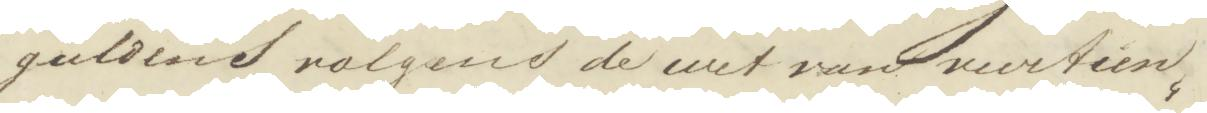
guldens volgens de wet van veertien„
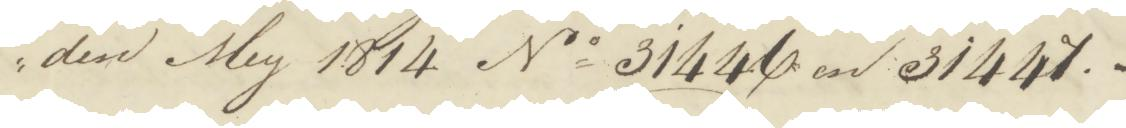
„den Mey 1814 N=o 31446 en 31441. —
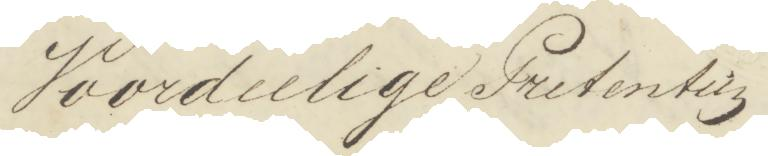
Voordeelige Pretentien
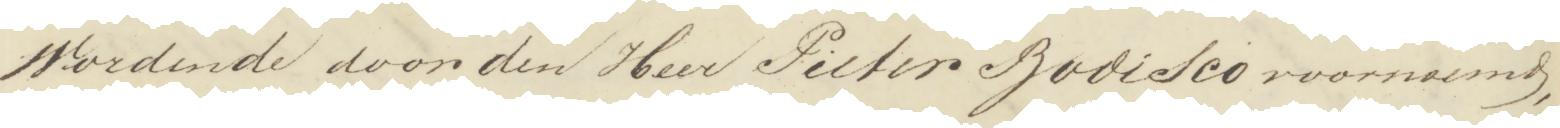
Wordende door den Heer Pieter Bodisco voornoemd,
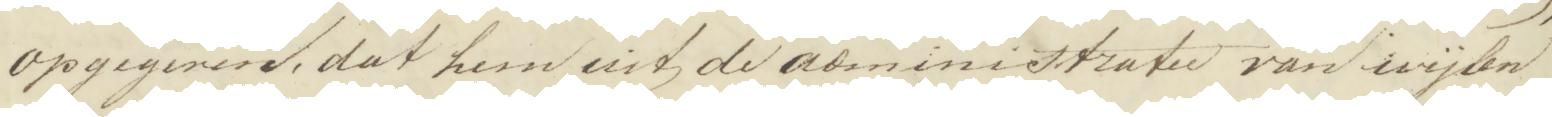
opgegeven, dat hem uit de administratie van wijlen
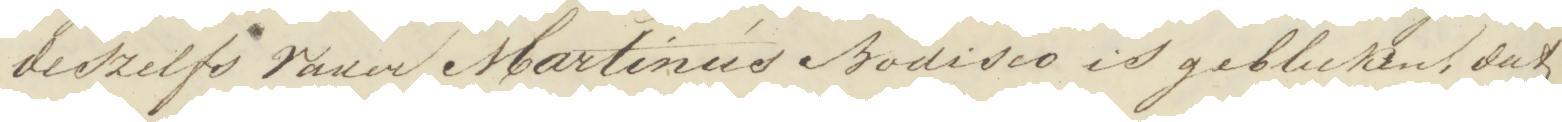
deszelfs Vader Martinus Bodisco is gebleeken, dat
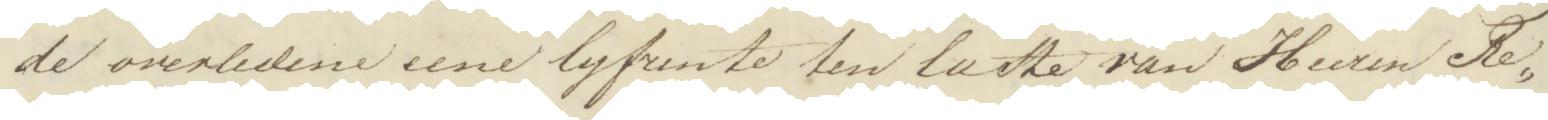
de overledene eene lyfrente ten laste van Heeren Re„
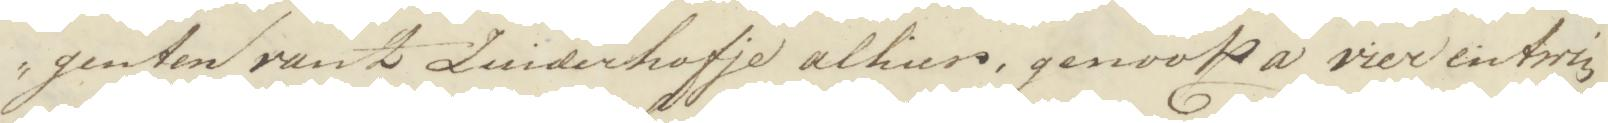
„genten van ’t Zuiderhofje alhier, genoot a vier en twin„
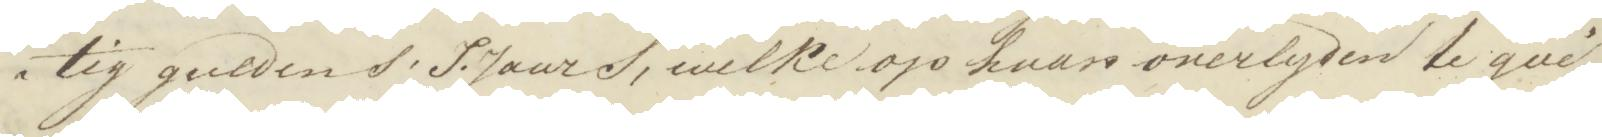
„tig guldens 's. Jaars, welke op haar overlyden te goe
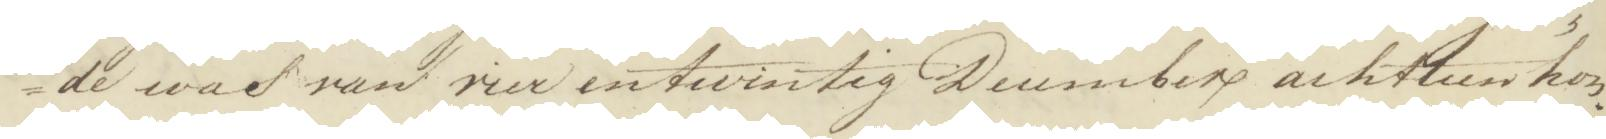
„de was van vier en twintig December achttien hon„
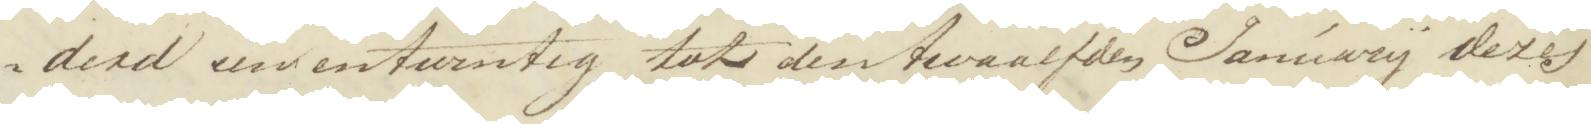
„derd een en twintig tot den twaalfden Ianuarij dezes
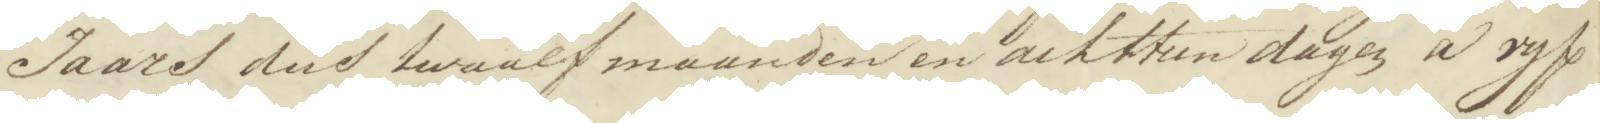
Iaars dus twaalf maanden en achttien dagen a vyf
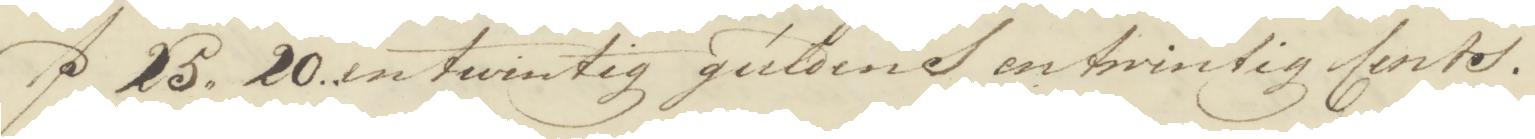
ƒ 25„ 20.. en twintig guldens en twintig Cents. —
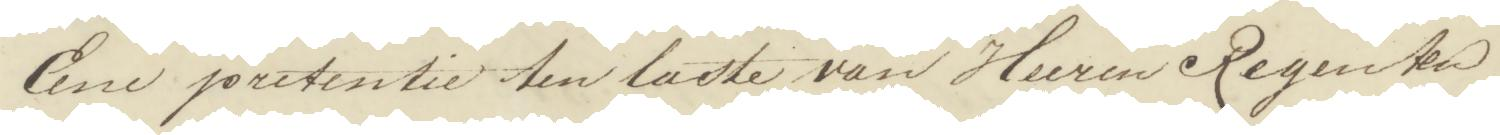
Eene pretentie ten laste van Heeren Regenten
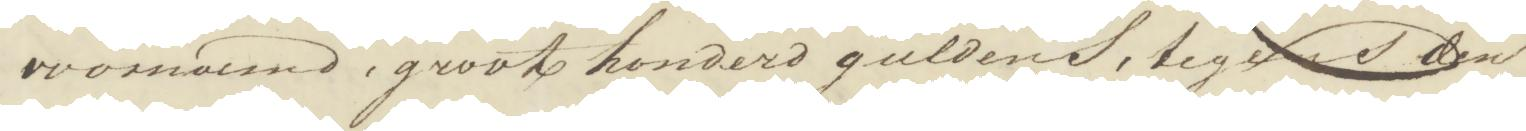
voornoemd, groot honderd guldens, tegens den
